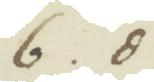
6. d
